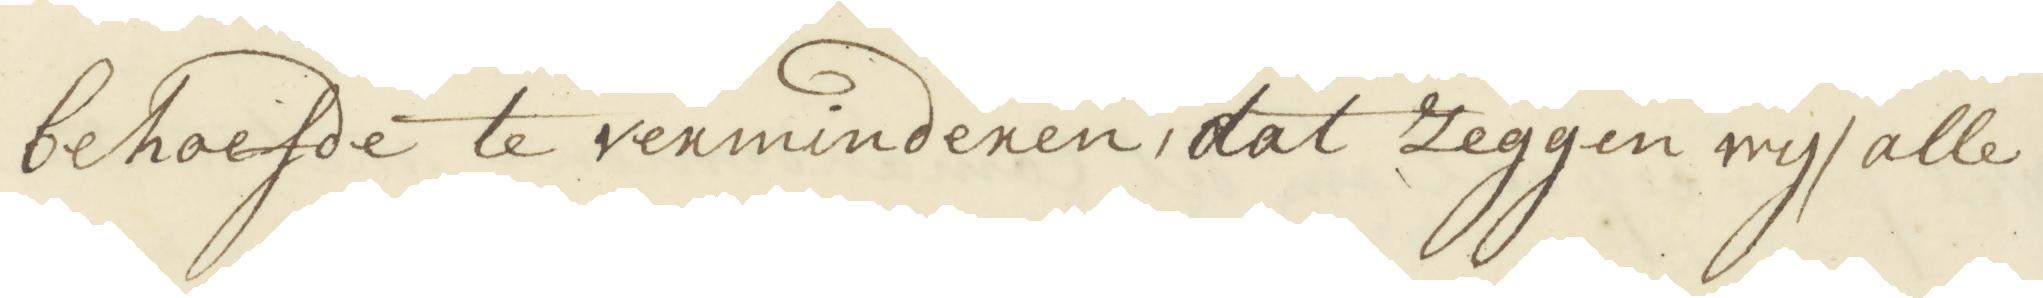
behoefde te verminderen, dat zeggen wy /alle
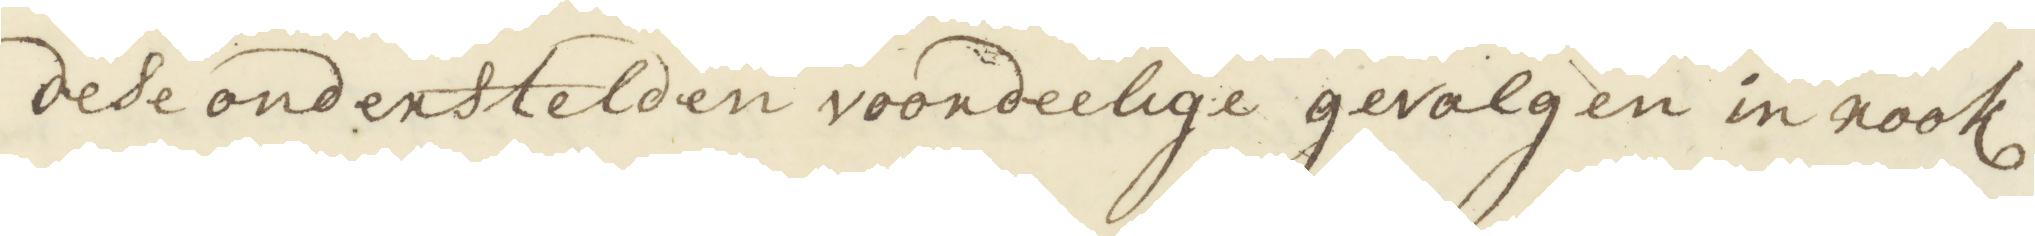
dese onderstelden voordeelige gevolgen in rook
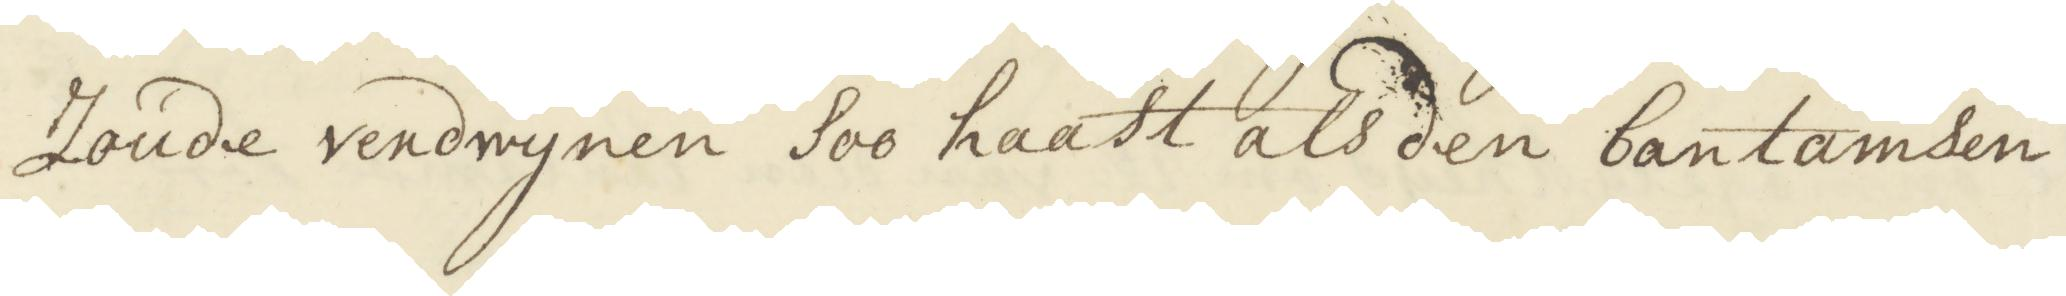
Zoude verdwynen soo haast als den bantamsen
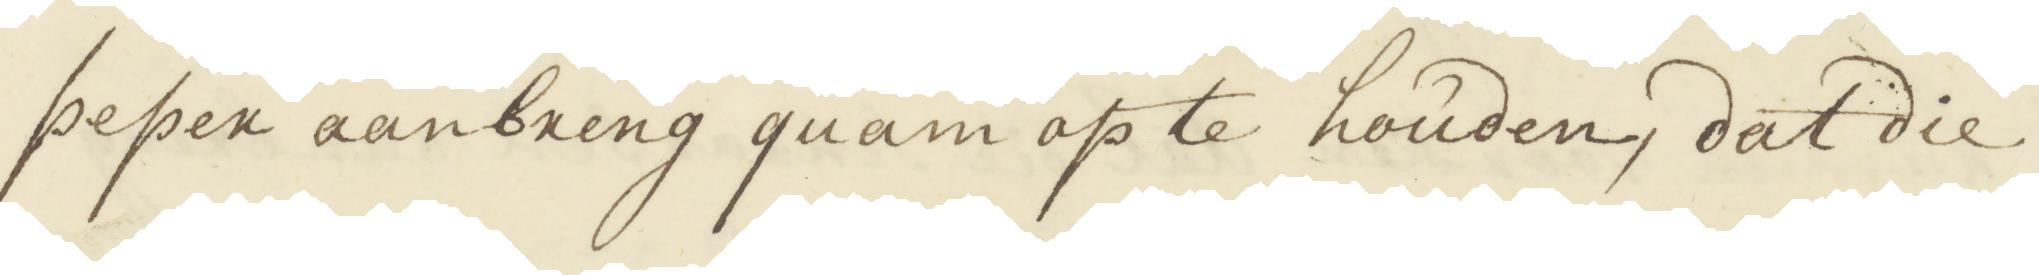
peper aanbreng quam op te houden, dat die
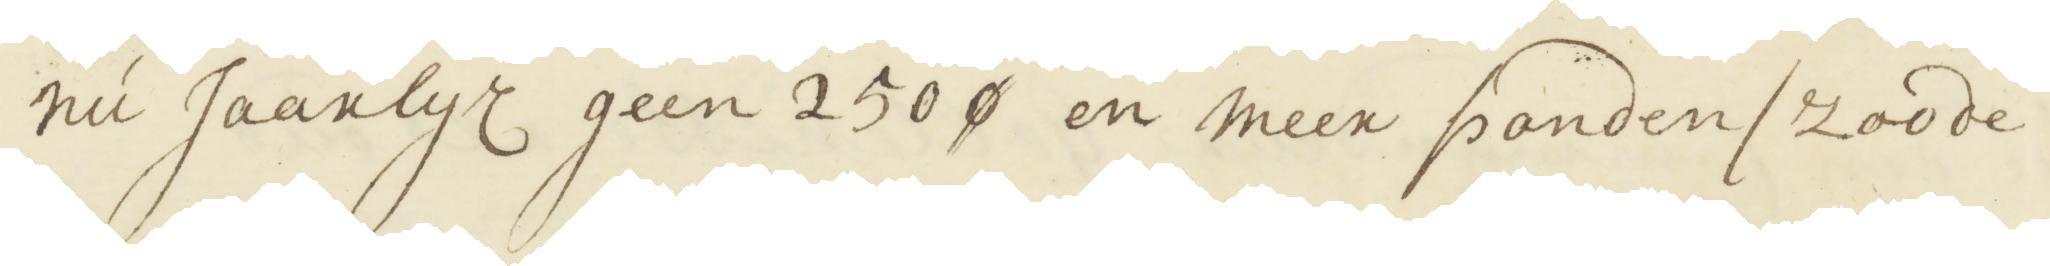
nu jaarlyx geen 250 o en meer ponden (zoo de
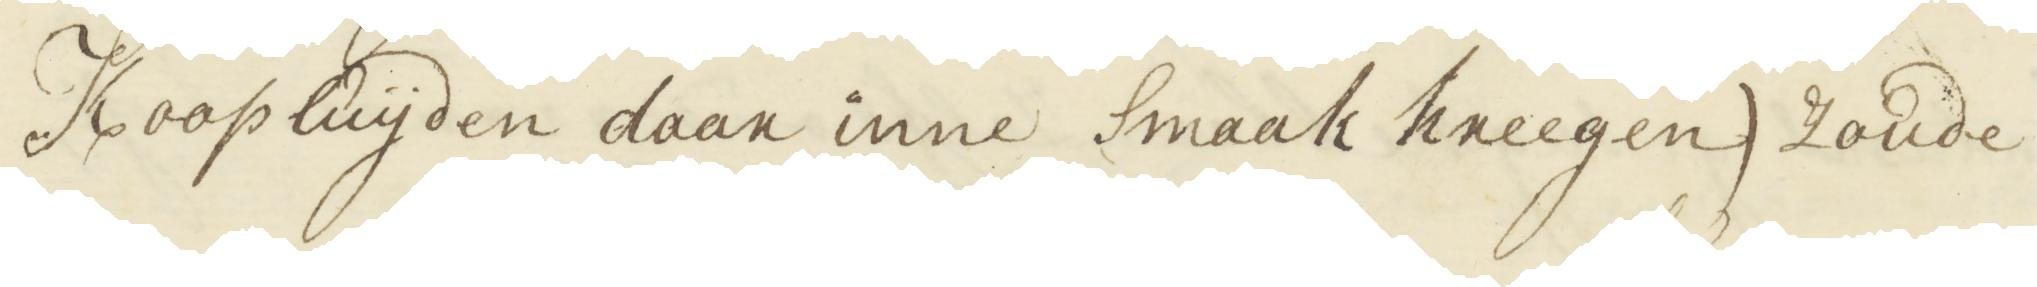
Koopluijden daar inne smaak kreegen) zoude
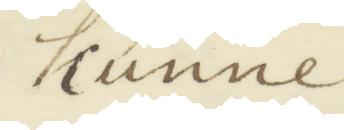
kunne
